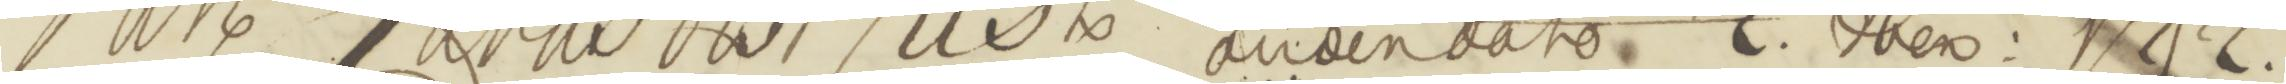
Van Javas oost Cust onderdato 2. 8ber: 1742.
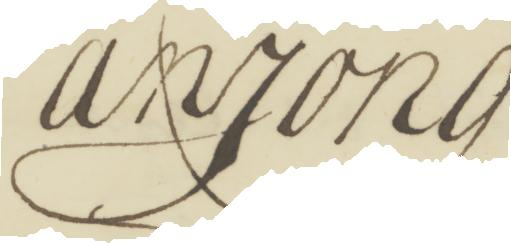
Tanjong
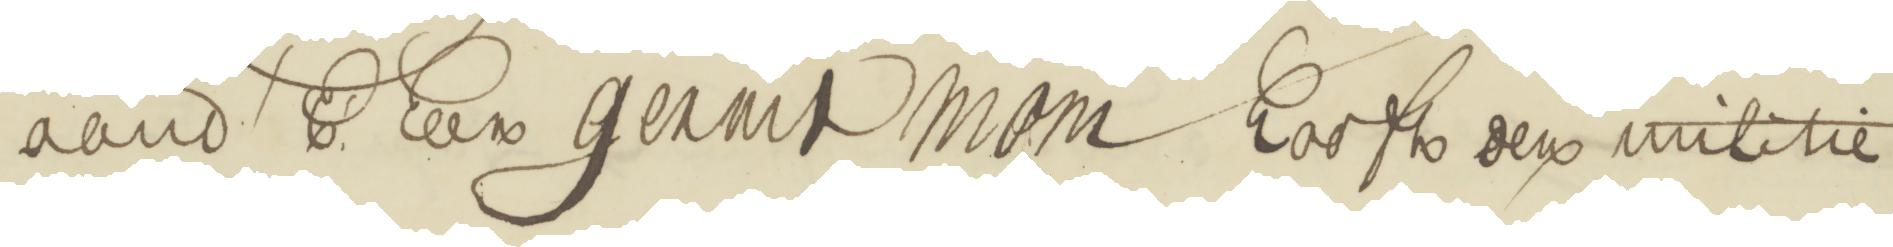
aan d’ E: heer gerrit mom hooft der militie
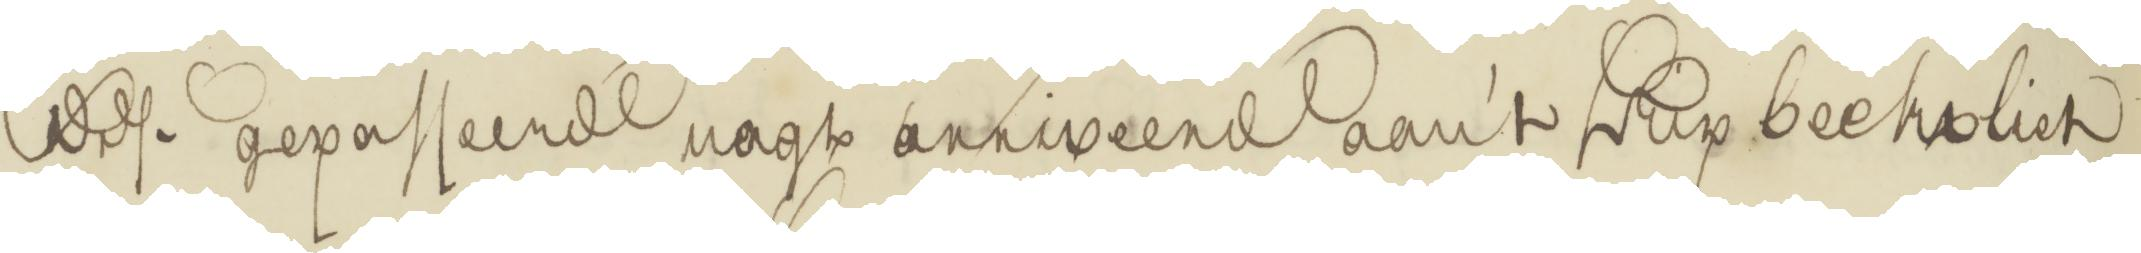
Dese gepasseerde nagt arriveerde aan ’t schip beekvliet
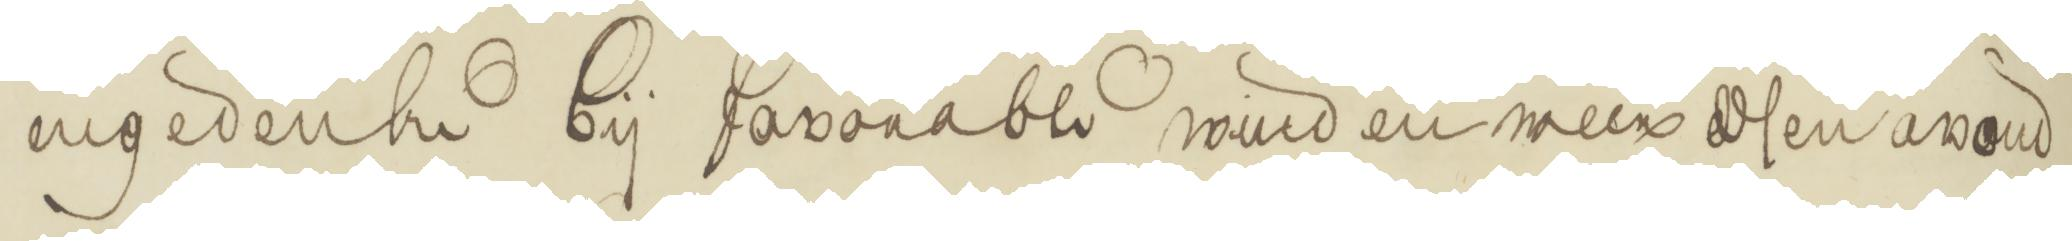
engedenke bij favorable wind en weer desen avond
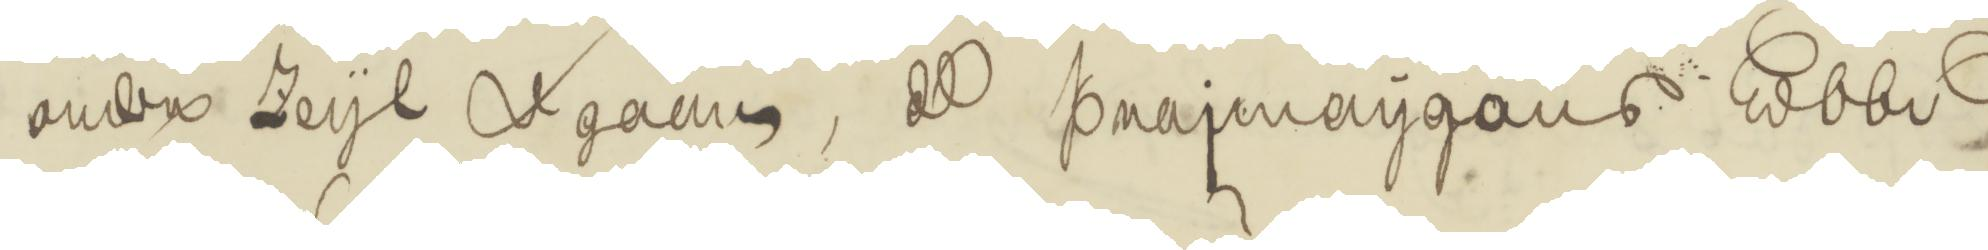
onder zeijl tegaan, de prajmaijgans hebbe
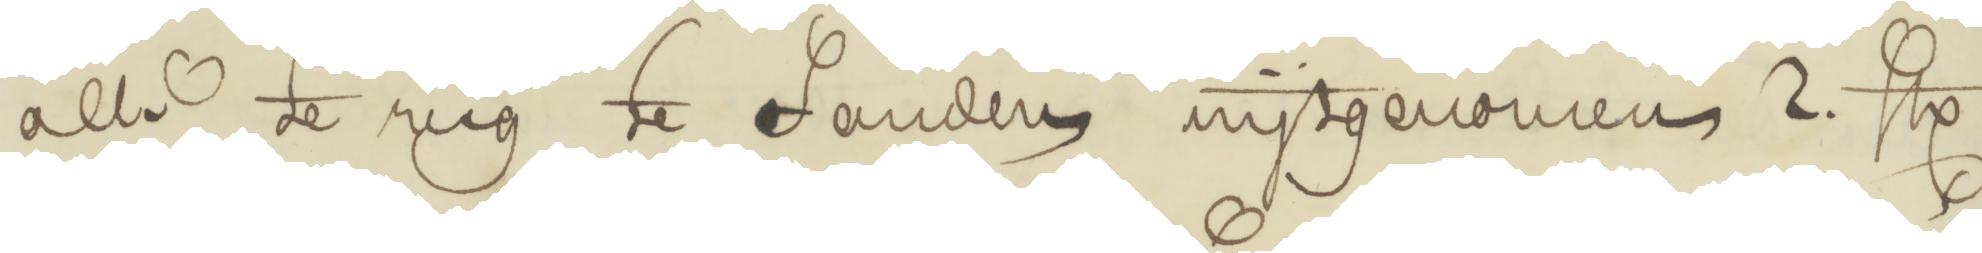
alle te rug te souden uijtgenomen 2. stx
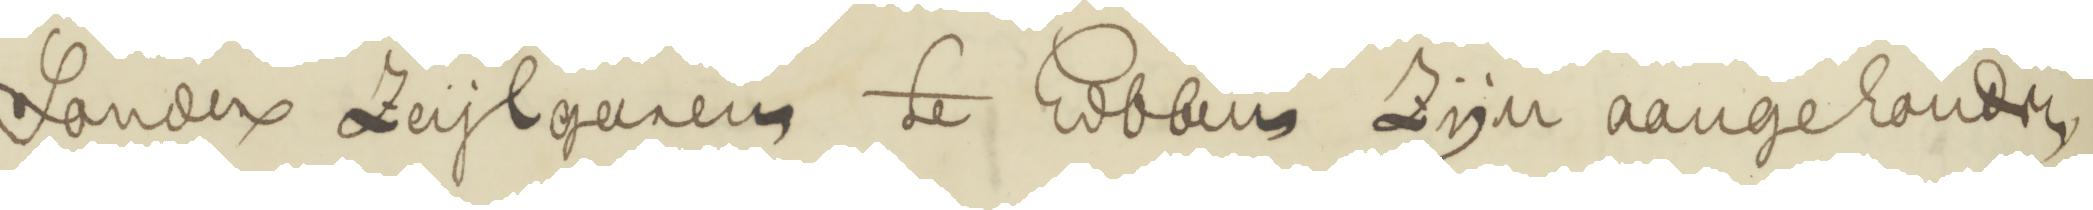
sonder zeijlgaren te hebben zijn aangehouden
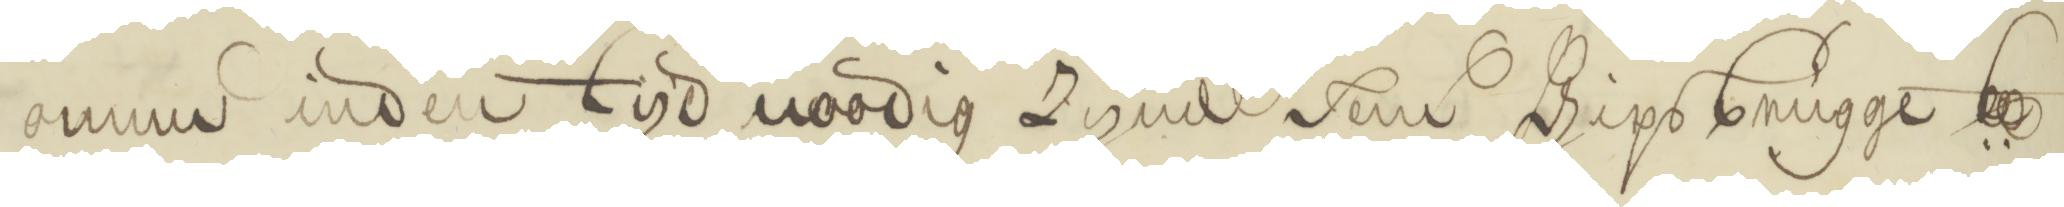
omme inden tijd noodig zijnde Eene schipsbrugge be
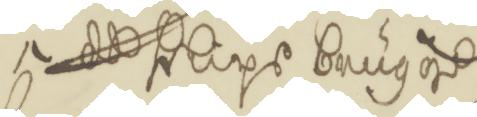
^de schips brugge
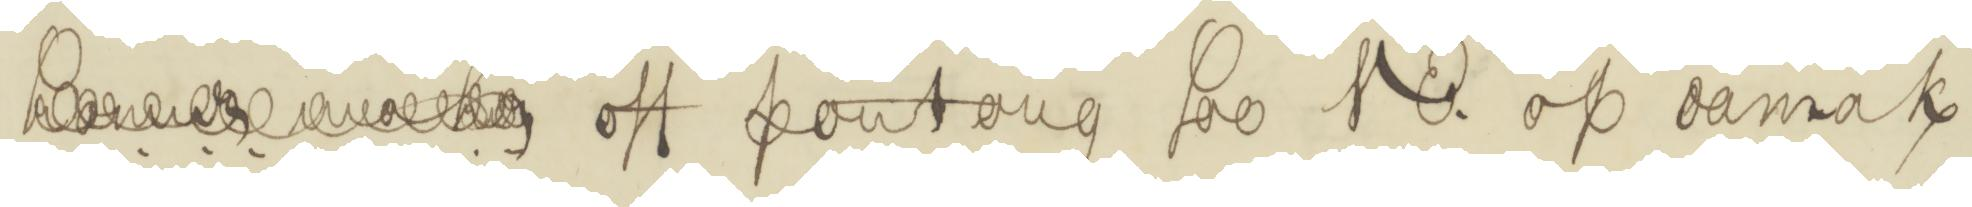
nevens moeken off pontong soo VE: op damak
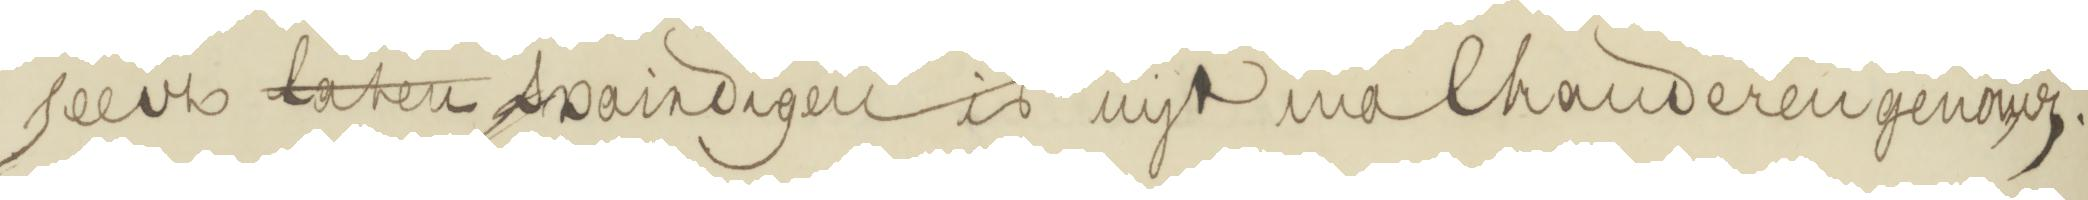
heevt laten vervairdigen is uijt malkanderen genomen.
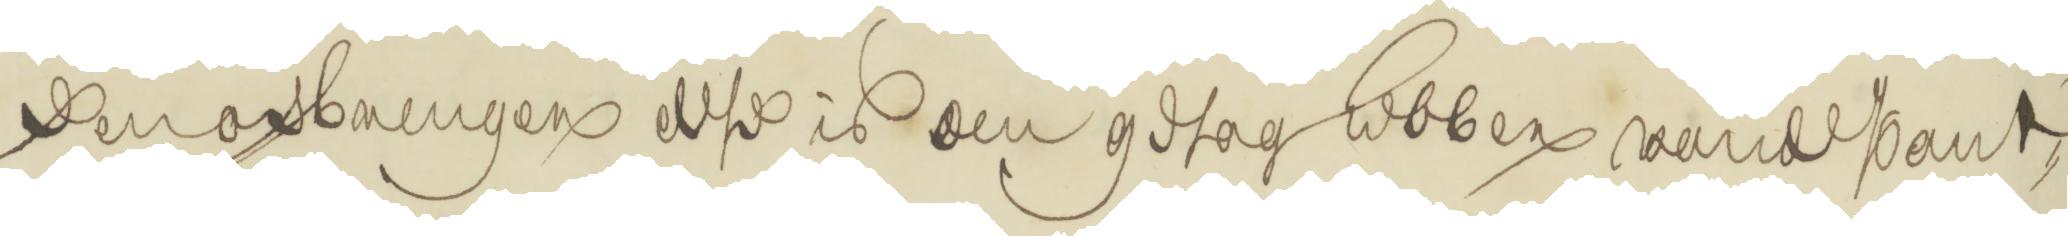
Den overbrenger dese is den gesaghebber vande pant„
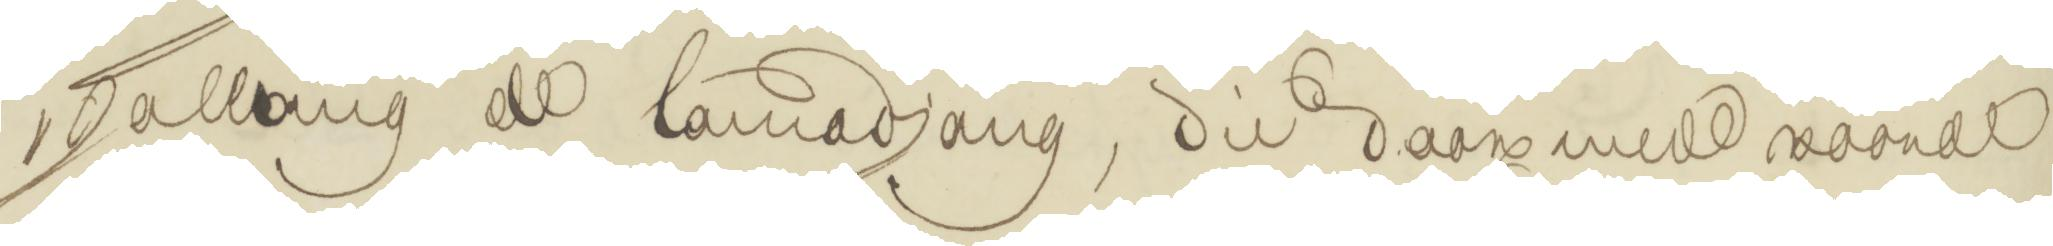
„jallang de lamadjang, die daar mede voorde
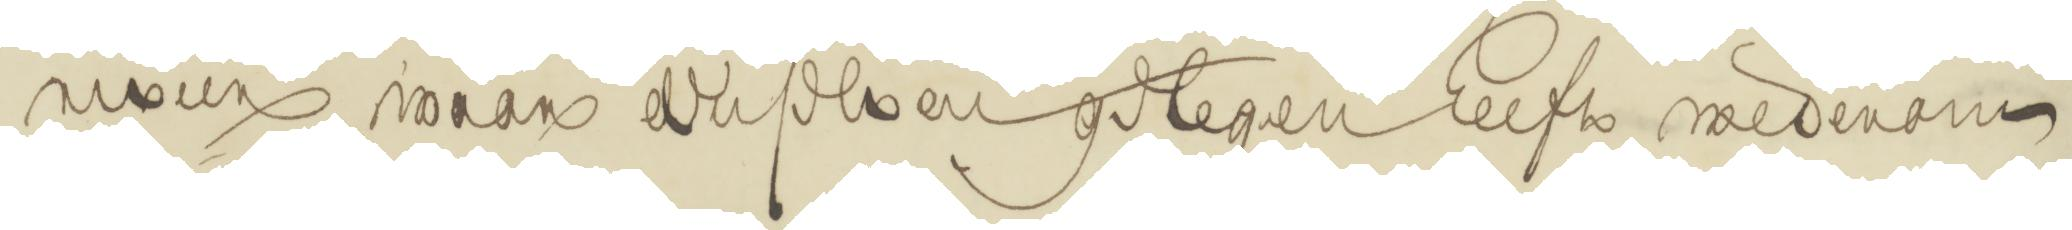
rivier waar denselven gelegen heeft wederom
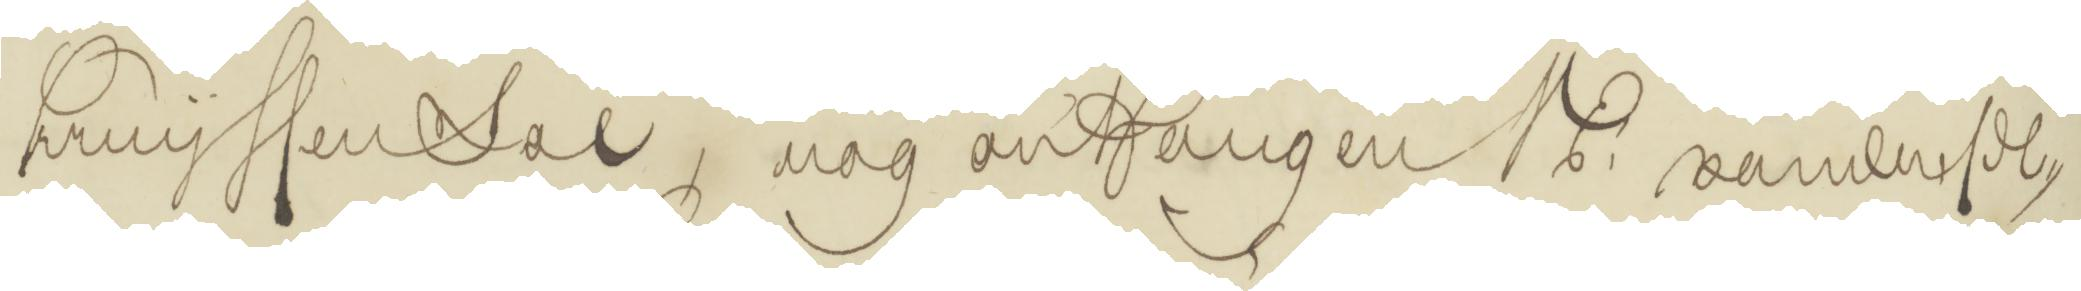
kruijssen sal, nog ontfangen VE: vandensel„
